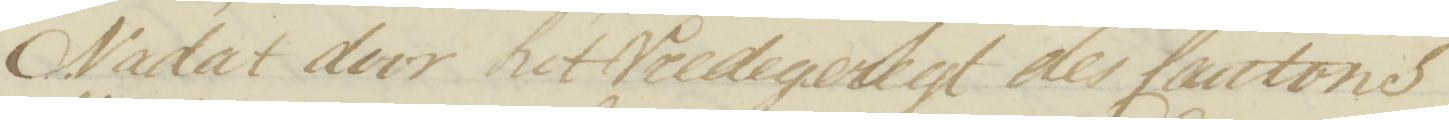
Nadat door het Vredegeregt des Cantons
